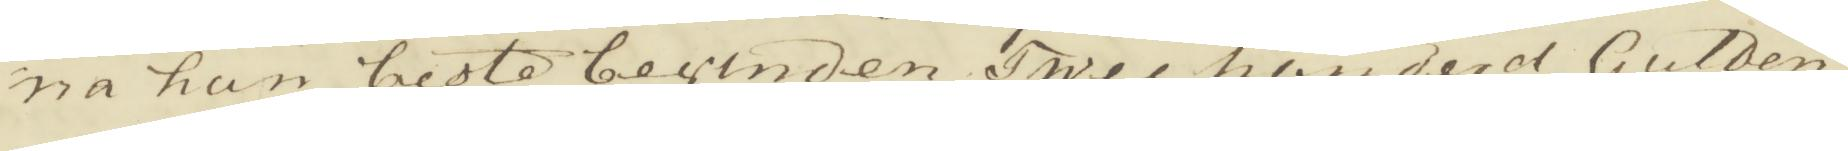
na hun beste bevinden Twee honderd Gulden
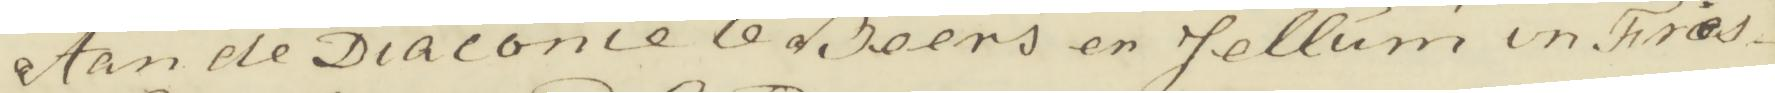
Aan de Diaconie te Boers en Jellum in Fries„
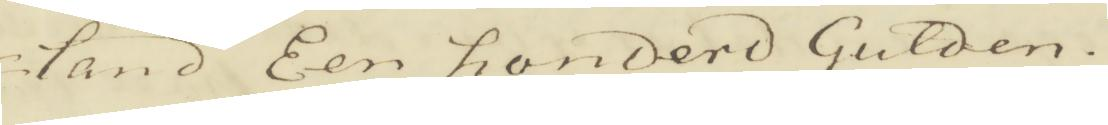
land Een honderd Gulden.
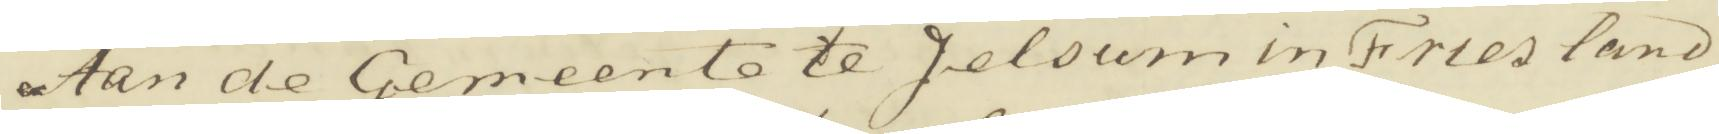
Aan de Gemeente te Jelsum in Fries land
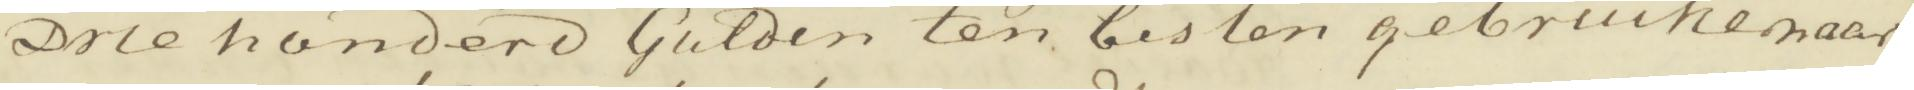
Drie honderd Gulden ten besten gebruike naar
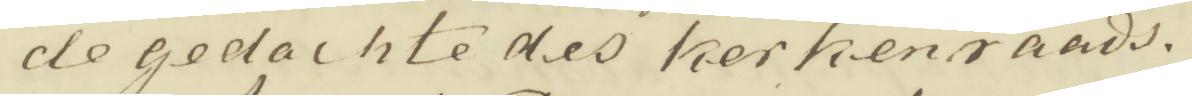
de gedachte des Kerkenraads.
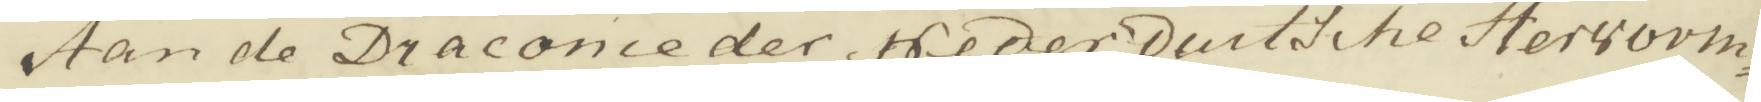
Aan de Diaconie der Nederduitsche Hervorm=
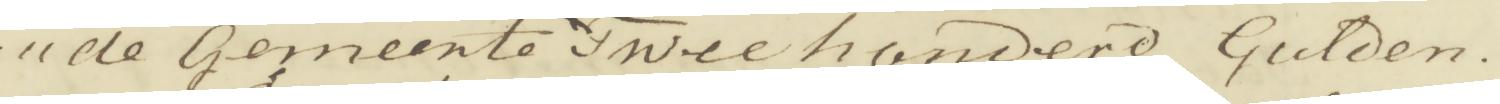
„de Gemeente Twee honderd Gulden.
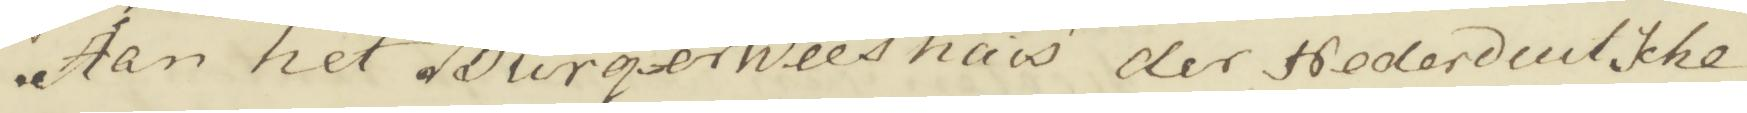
Aan het Burgerweeshuis der Nederduitsche
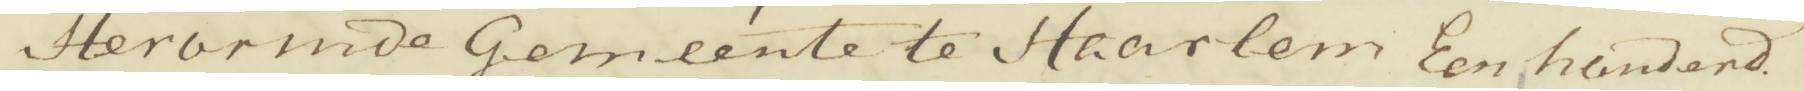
Herormde Gemeente te Haarlem Een honderd.
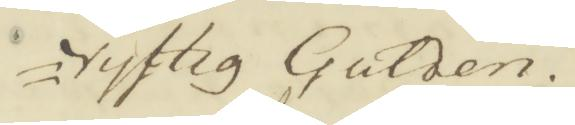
=Vyftig Gulden.
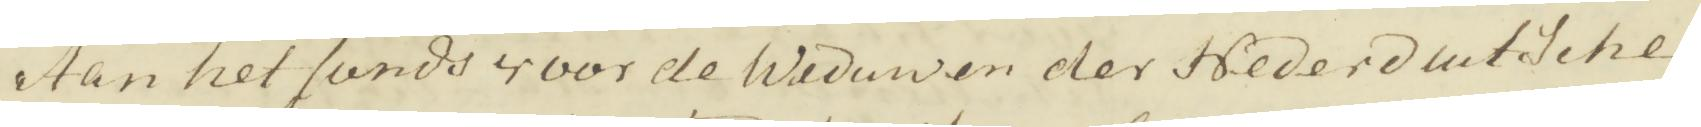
Aan het fonds voor de Weduwen der Nederduitsche
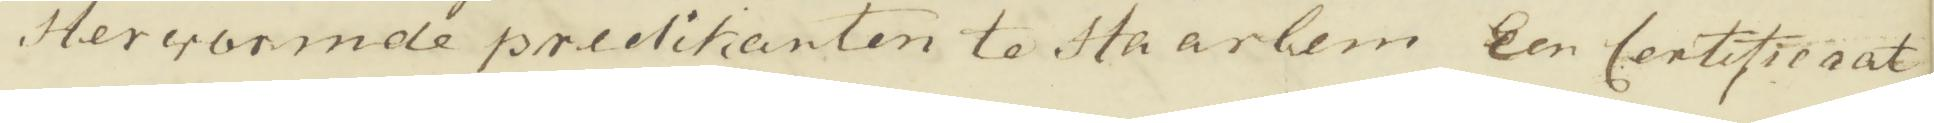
Hervormde predikanten te Haarlem Een Certificaat
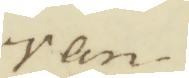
van-
